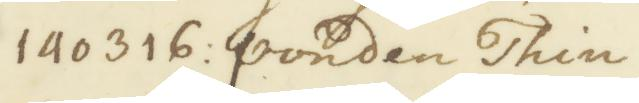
140316: ponden Thin
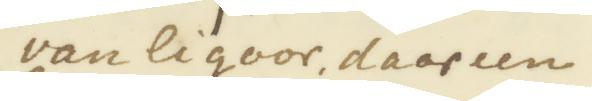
van ligoor, daar een
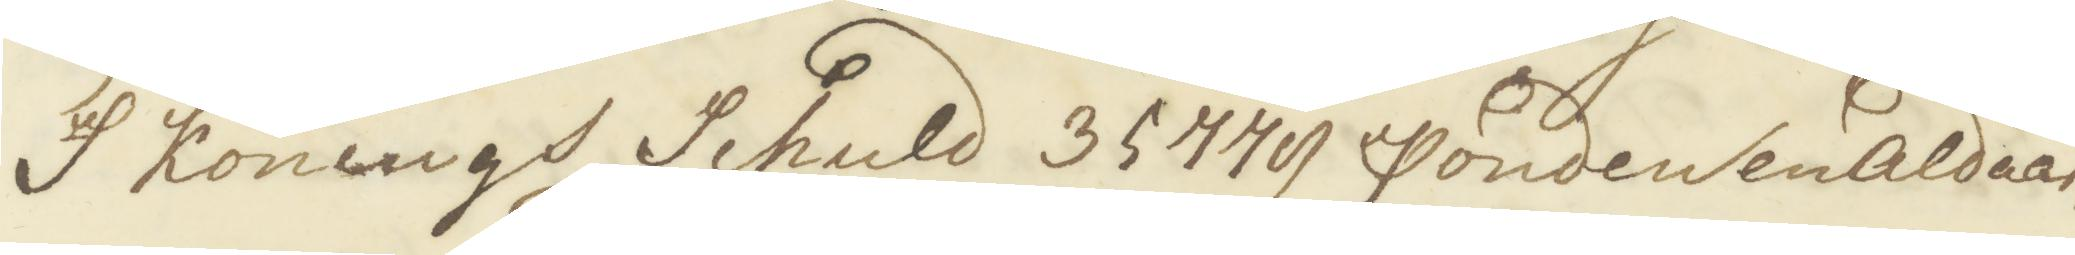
'S konings Schuld 35778 Ponden en aldaar
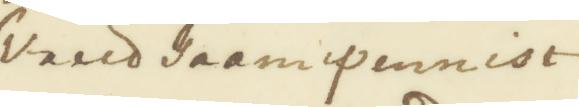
vreedsaam pennist
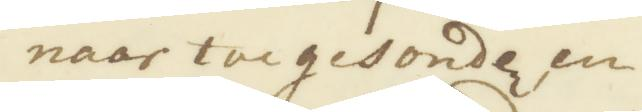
naar toegesonden, en
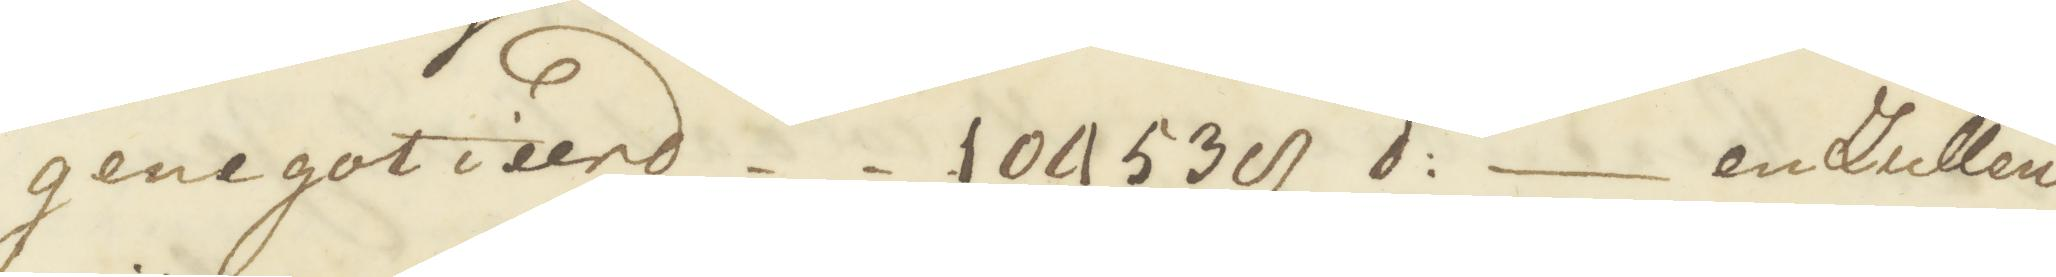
genegotieerd - - 104538 d:o — en zullen
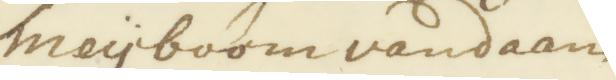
meijboom vandaan
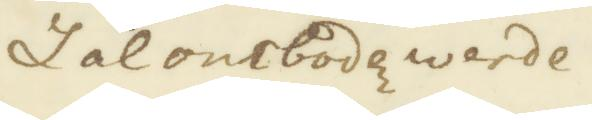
zal ontboden werde
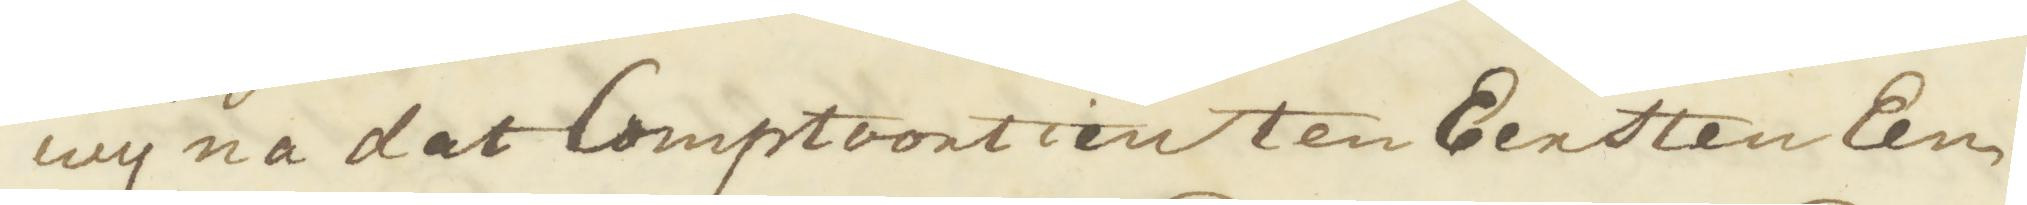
wij na dat Comptoortien ten Eerste Een
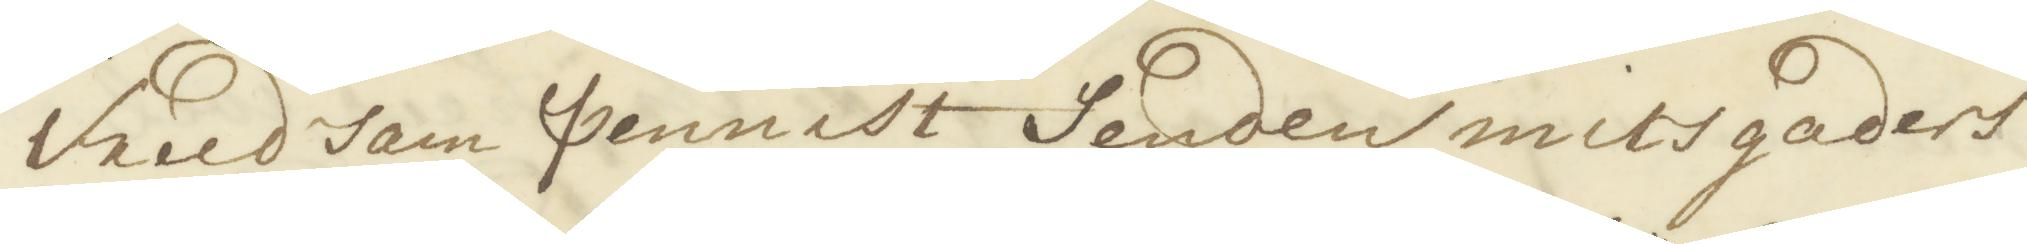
vreedsam pennist senden, mitsgaders
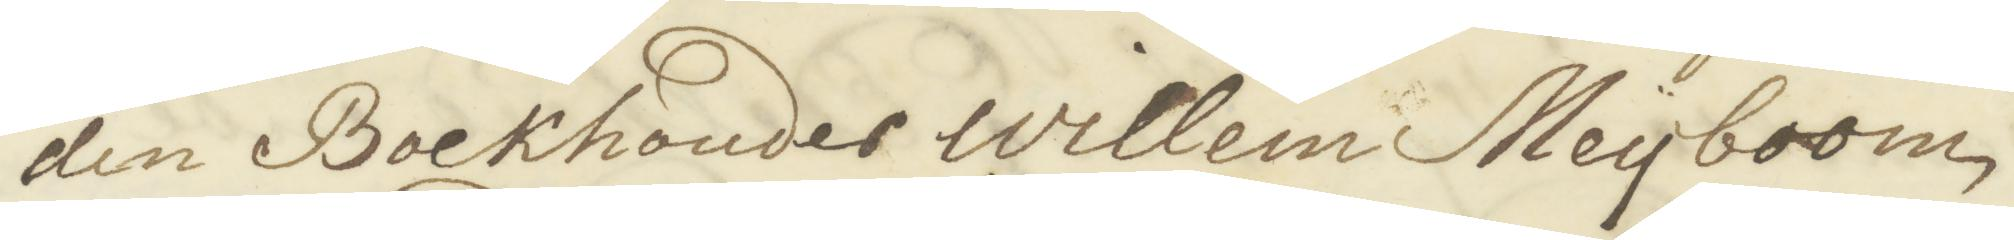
den Boekhouder willem Meijboom
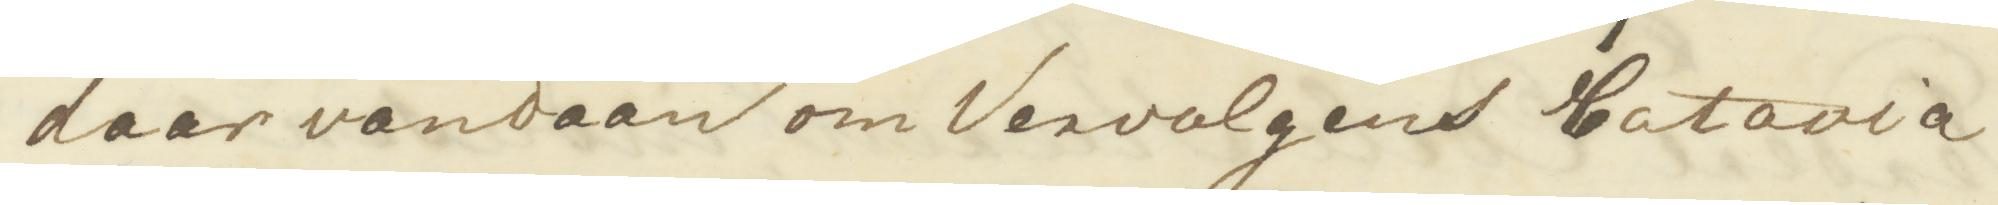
daar vandaan om vervolgens batavia
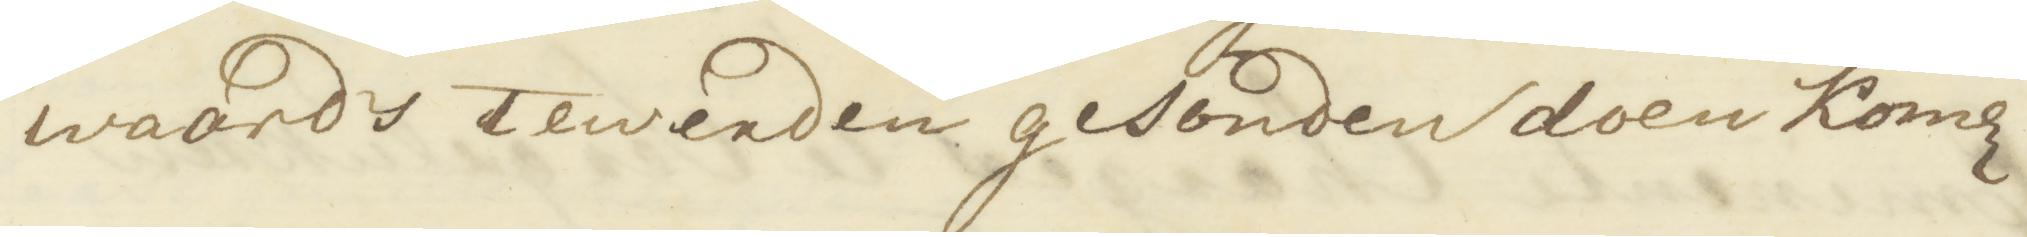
waards tewerden gesonden doen komen
